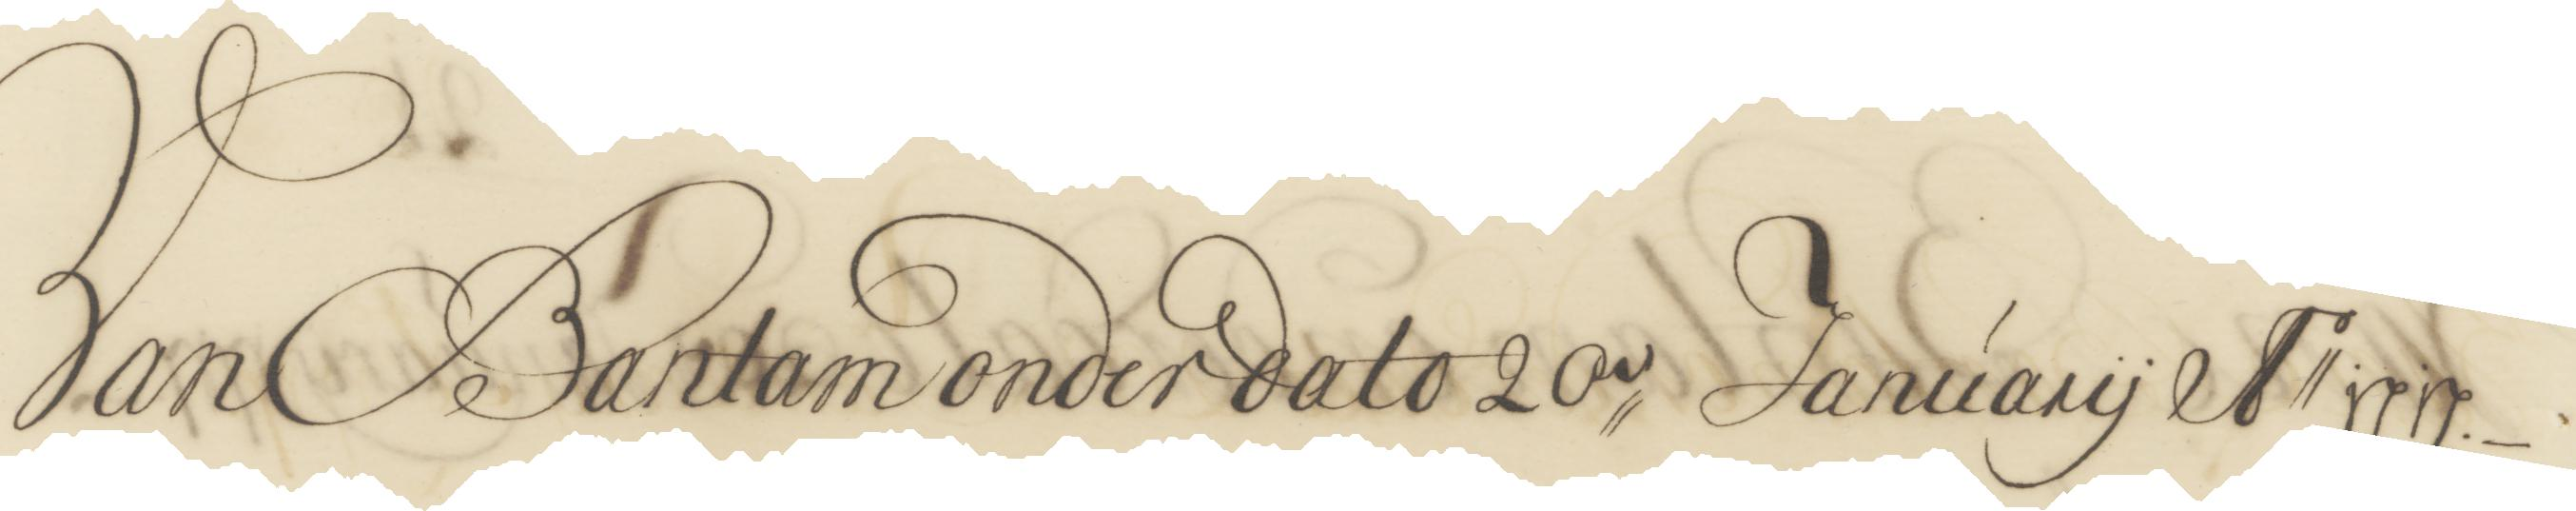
Van Bantam onder dato 20„e Januarij A„o 1717. —
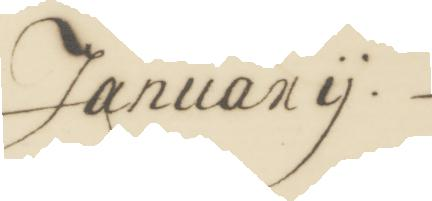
Januarij.
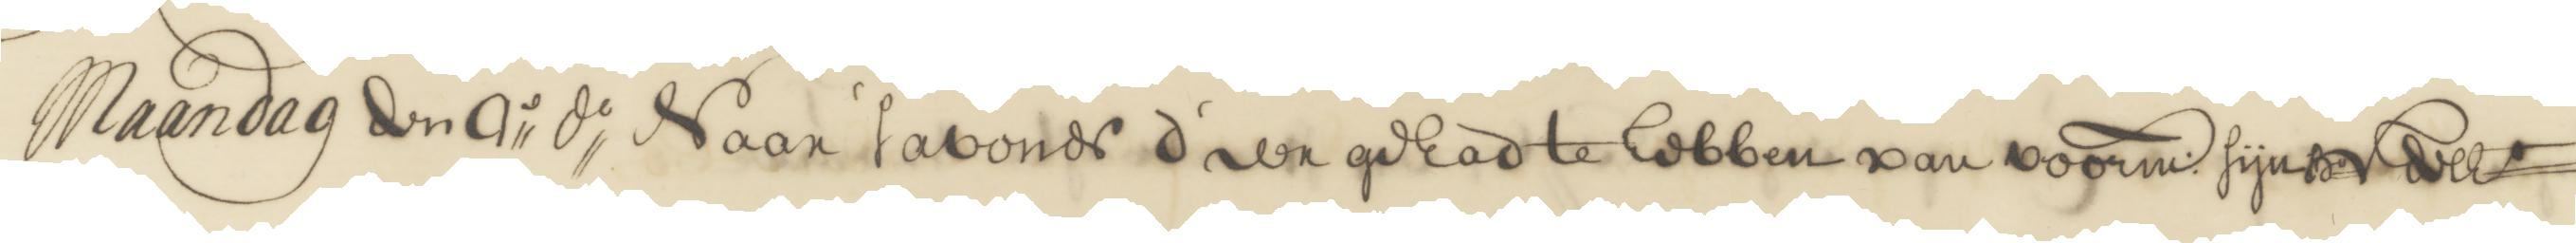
Maandag den 4„e d„o Naar ’s avonds d’eer gehad te hebben van voorm: sijn H=o Edelh=t
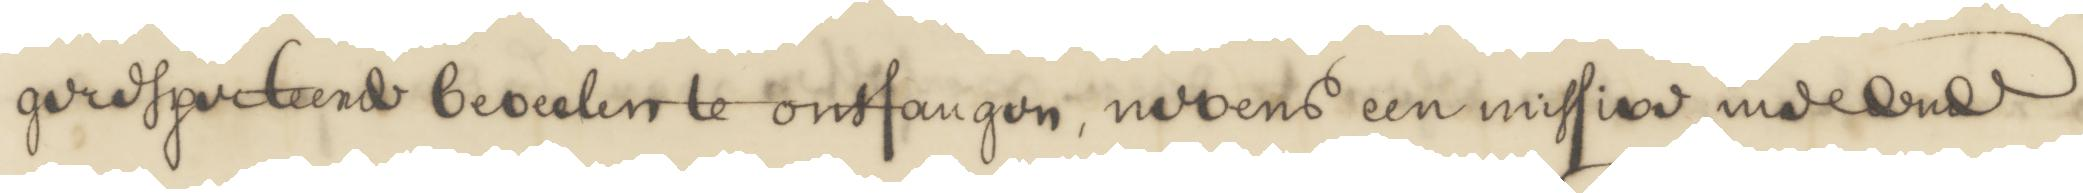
gerespecteerde beveelen te ontfangen, nevens een missive meedende
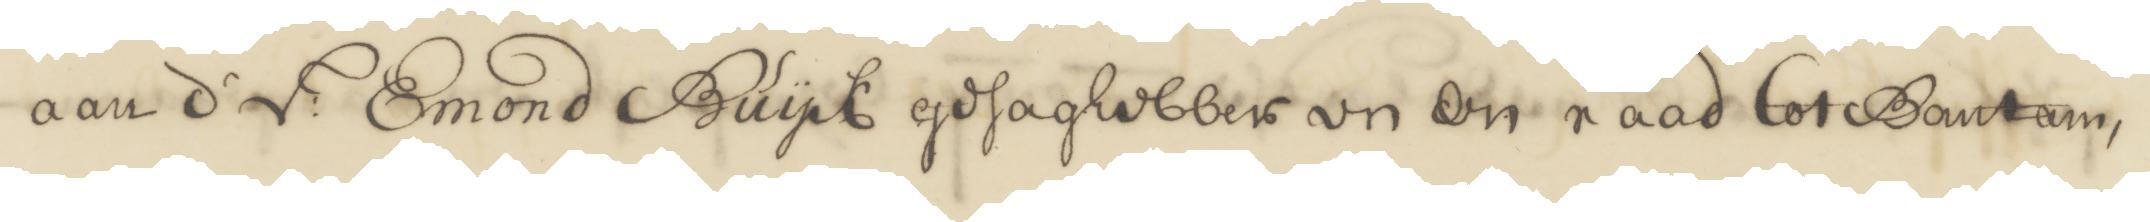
aan d’ E: Emond Buijck gesaghebber en den raad tot Bantam,
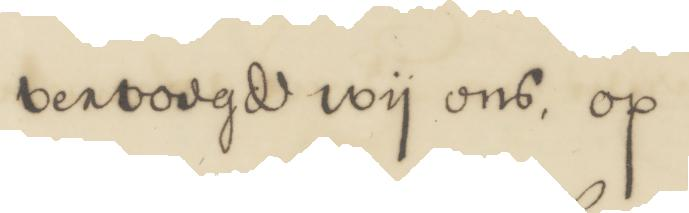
vervoegde wij ons, op
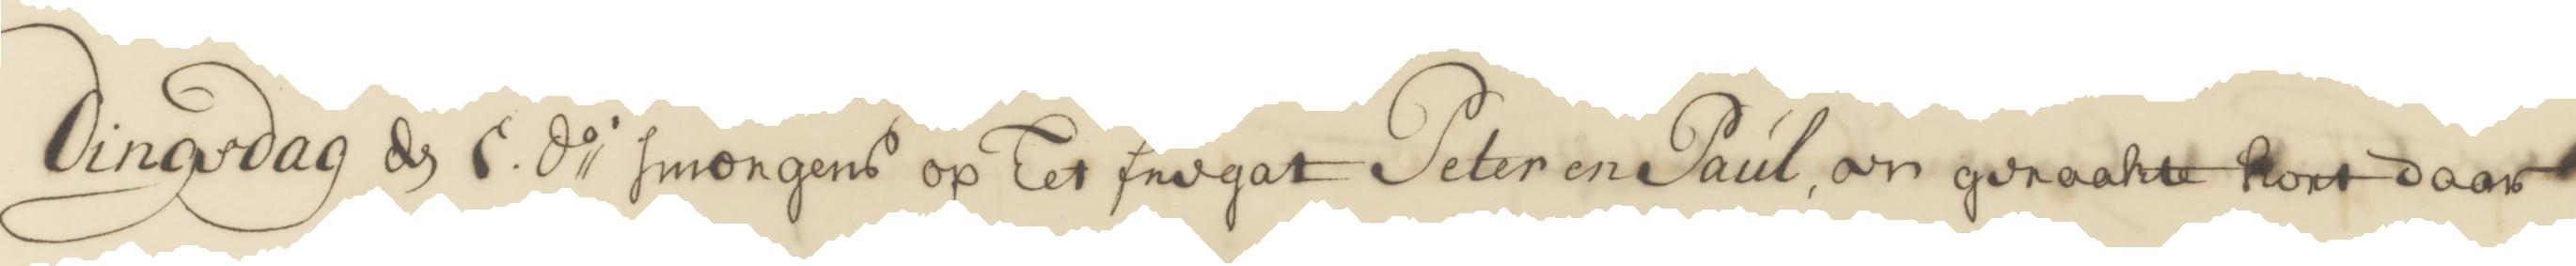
dingsdag den 5. d„o 'smorgens op het fregat Peter en Paul, en geraakte kort daar
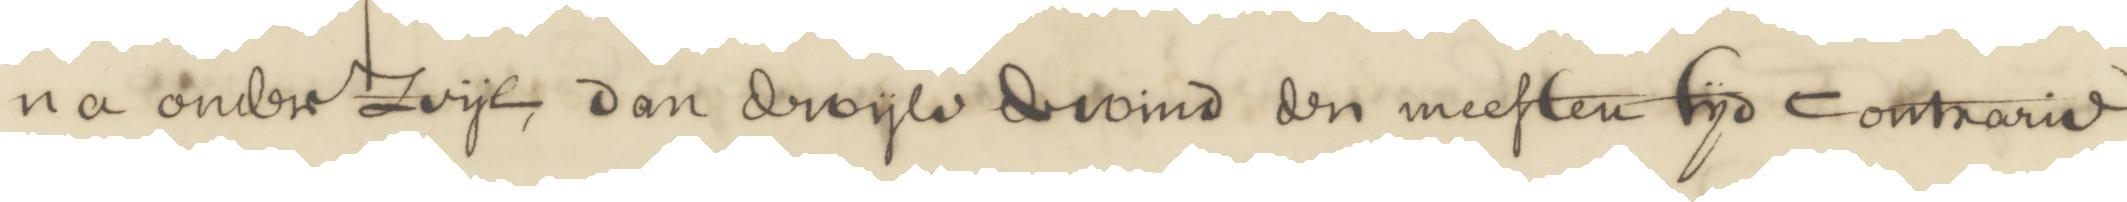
na onder zeijl, dan dewijle de wind den meesten tijd contrarie
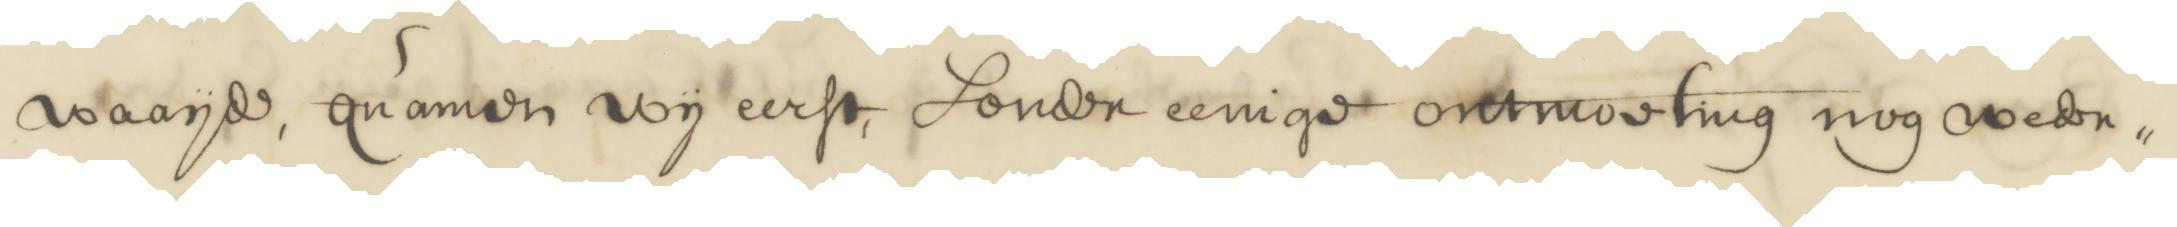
waaijde, quamen wij eerst, sonder eenige ontmoeting nog weder„
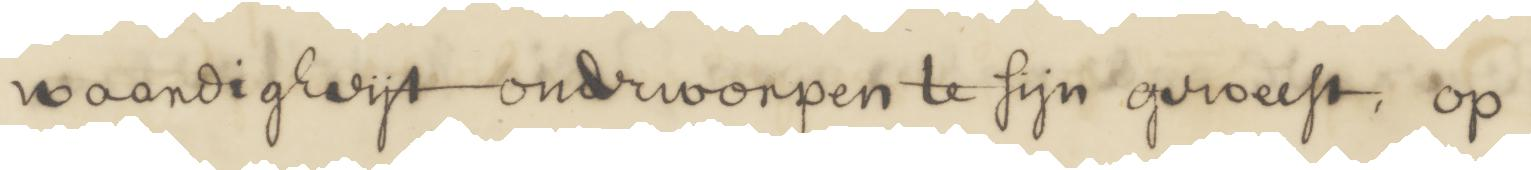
waardigheijt onderwerpen te sijn geweest, op
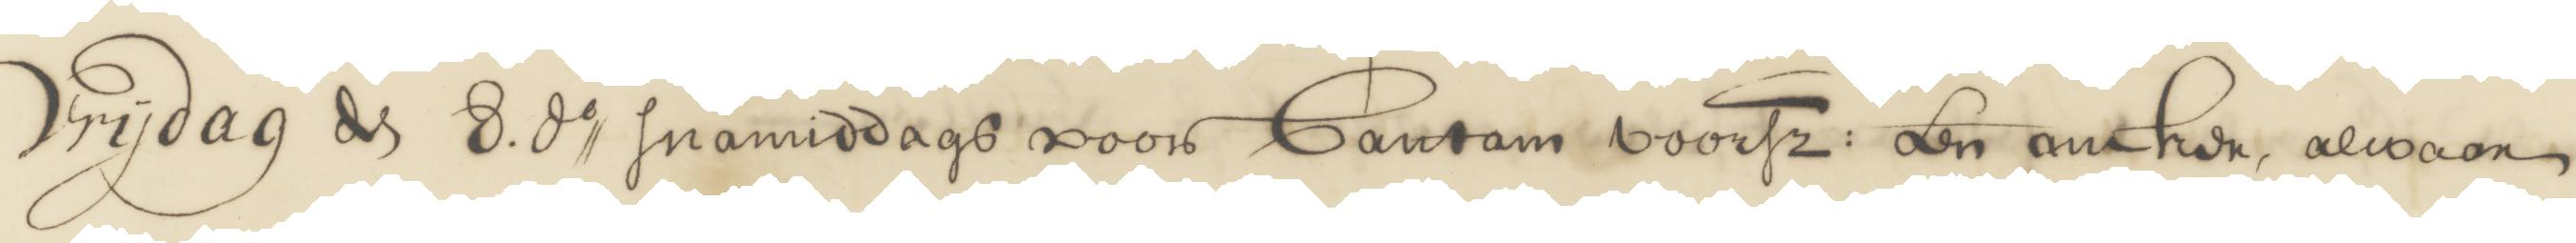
Vrijdag den 8. d„o 'snamiddags voor Bantam voorsz: ten ancker, alwaar
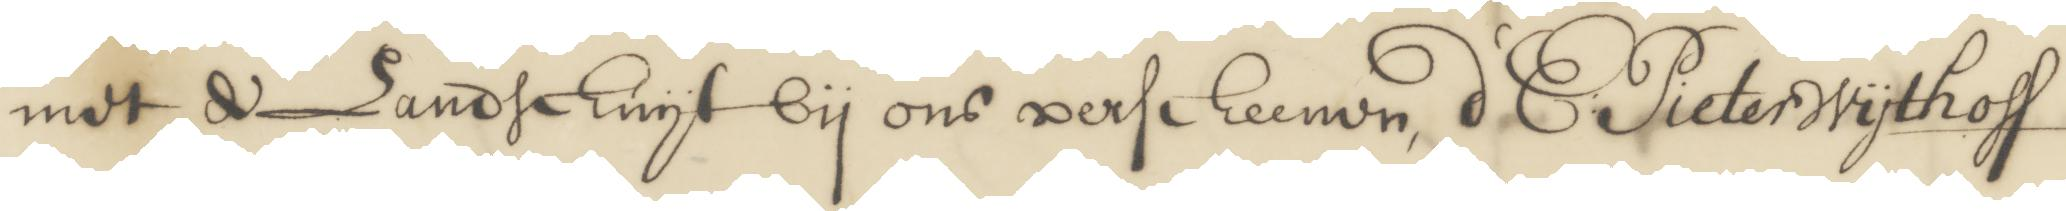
met de landschuijt bij ons verscheenen, d’ E: Pieter wijthoff
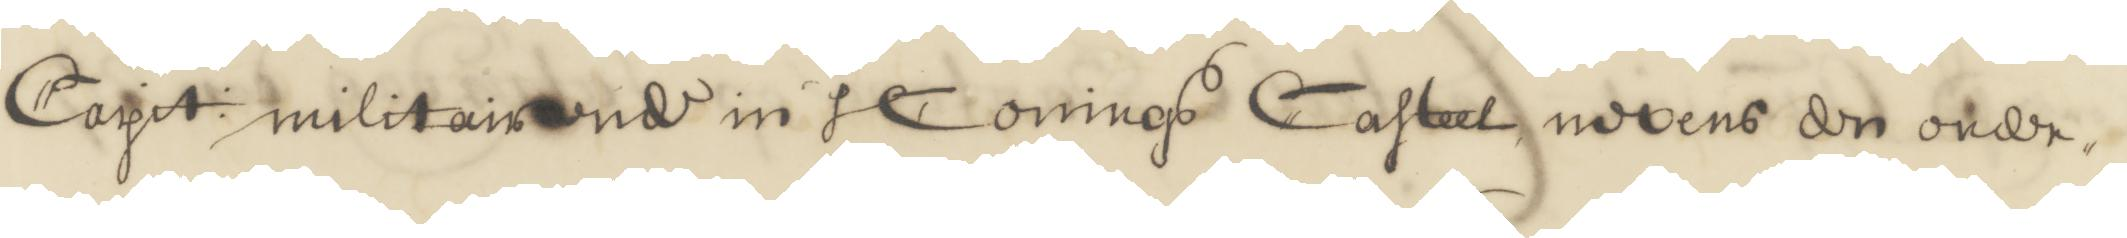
Capit: militair ende in 's Conings Casteel, nevens den onder„
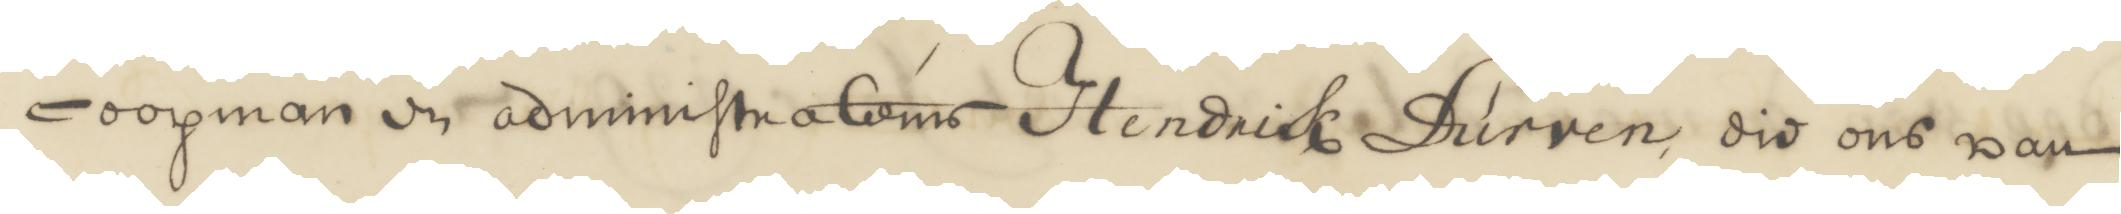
coopman en administrateur Hendrick Durven, die ons van
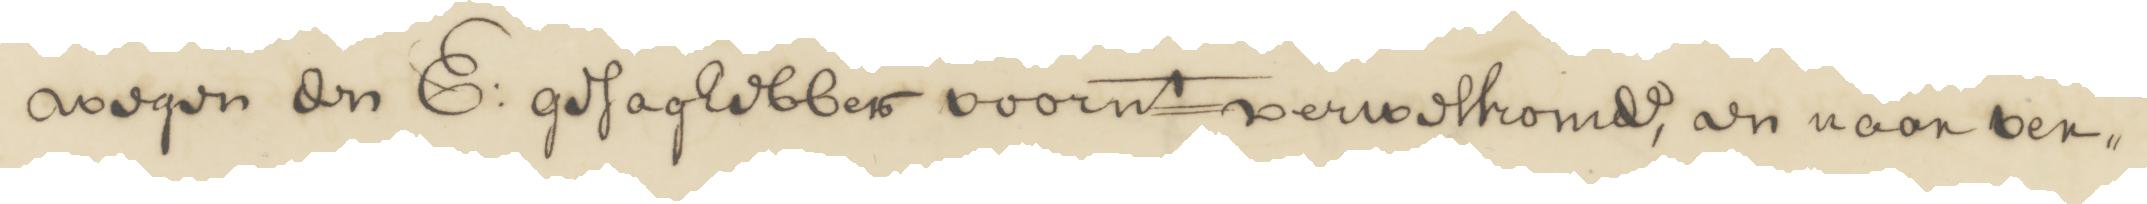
wegen den E: gesaghebber voorn=t verwelkomde, en naar ver„
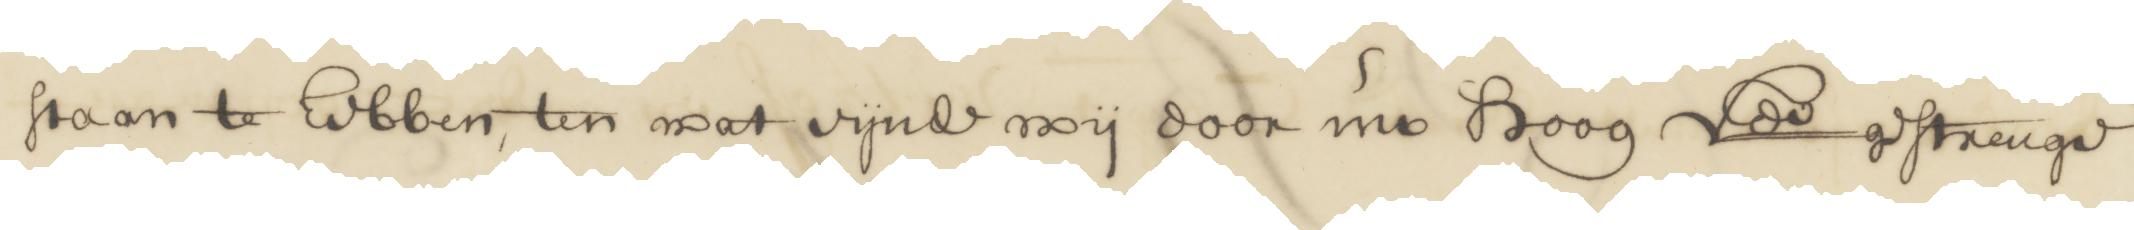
staan te hebben, ten wat eijnde wij door uw Hoog E=de gestrenge
